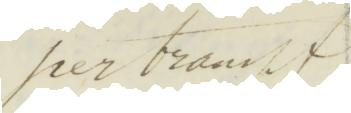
per transp
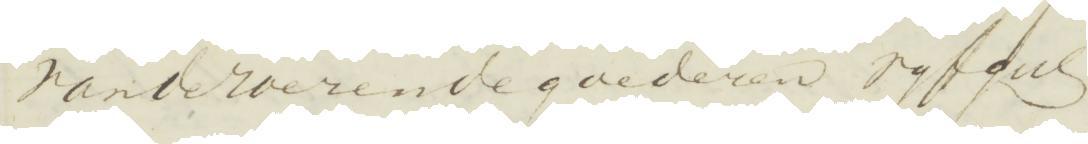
van de roerende goederen vyf gul
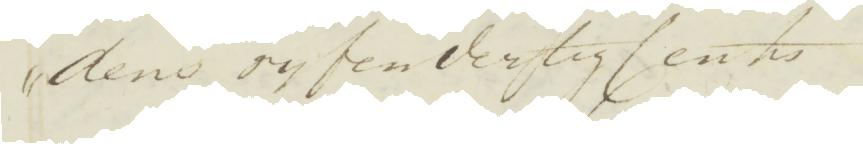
„dens vyf en dertig Cents
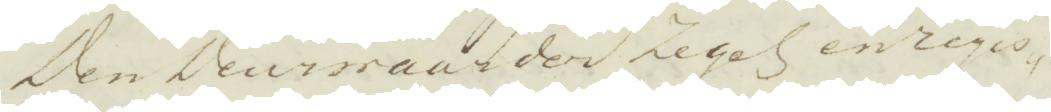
Den Deurwaarder Zegel en regis„
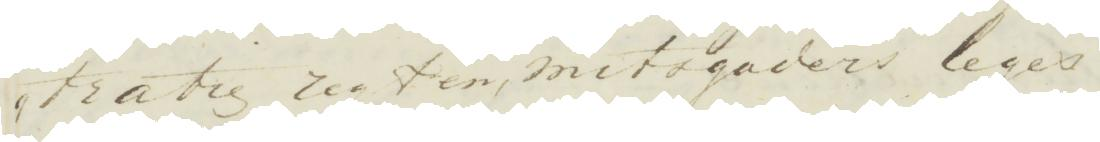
„tratie regten, mitsgaders leges
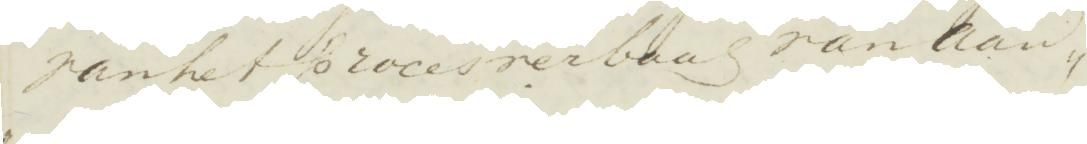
van het Proces verbaal van Aan„
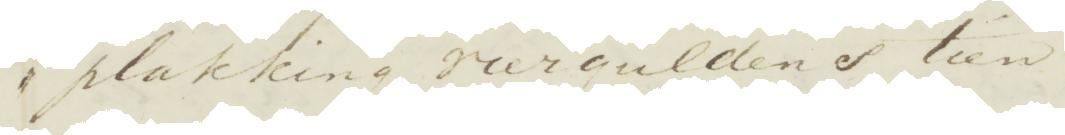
„plakking vier guldens tien
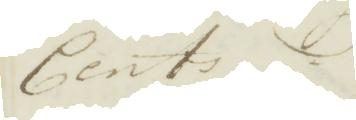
Cents _
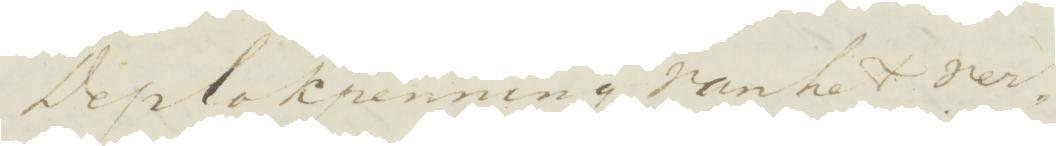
De plokpenning van het ver„
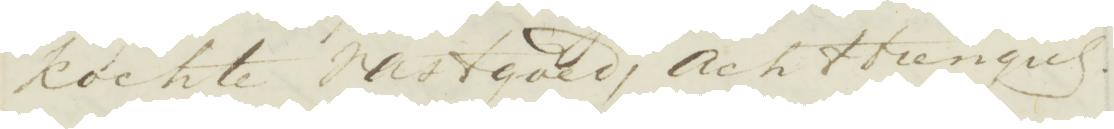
kochte vastgoed, achttien gul
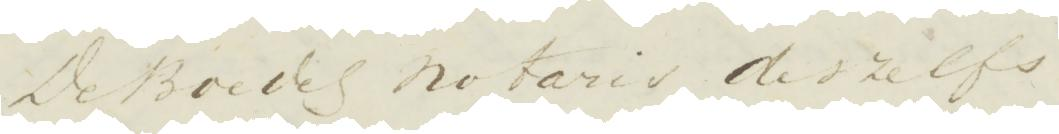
De Boedel Notaris deszelfs
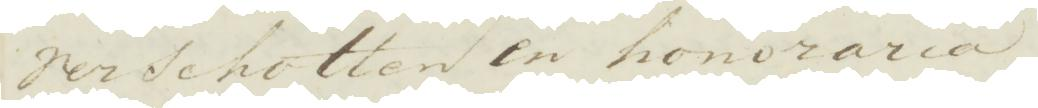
verschotten en honoraria
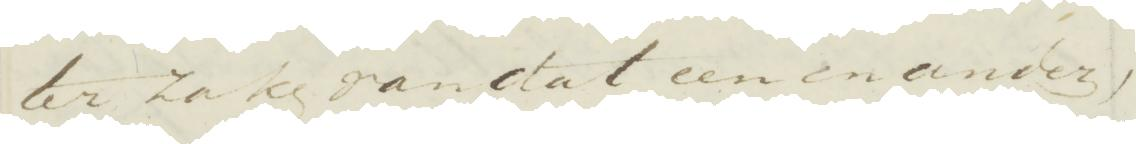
ter zake van dat een en ander,
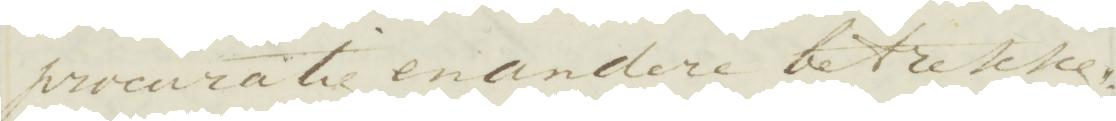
procuratie en andere betrekke„
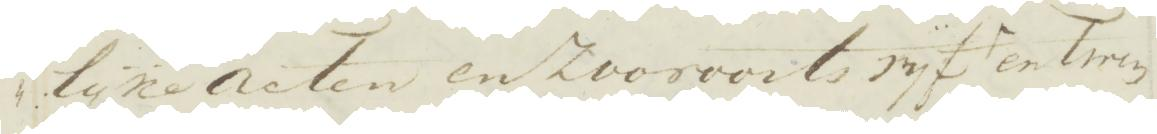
„lijke acten en zoo voorts vijf en twin
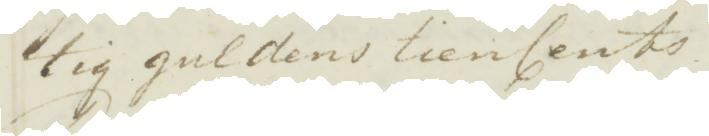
tig guldens tien Cents
